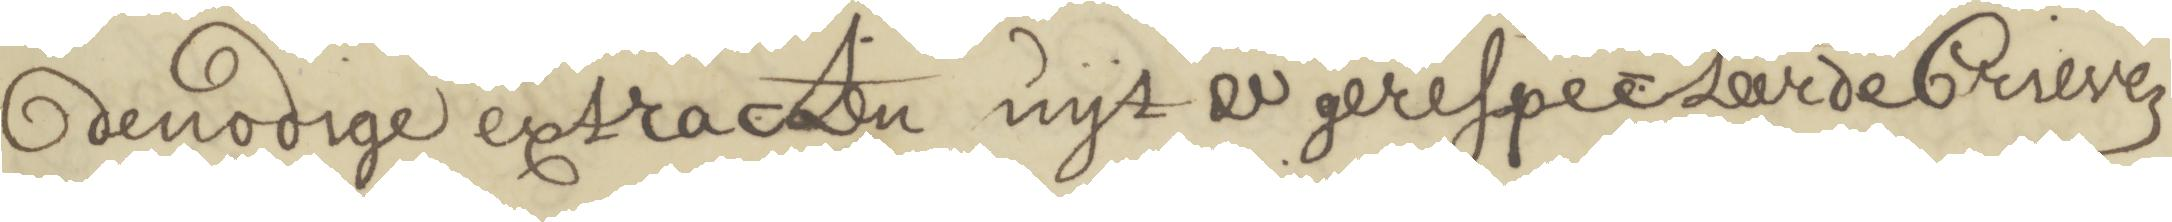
de nodige extracten uijt de gerespecteerde brieven
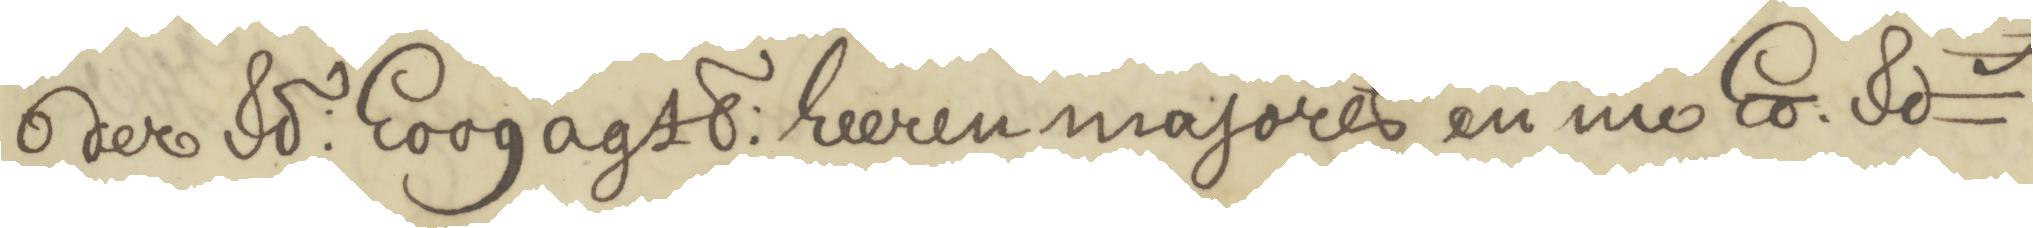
der Ed:' hoog agtb:' heeren majores en uw ho: Ed=s
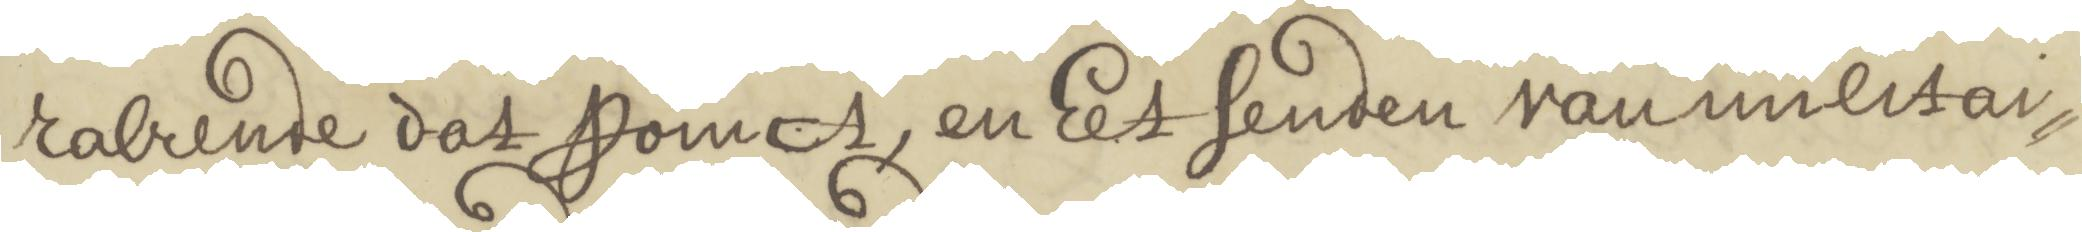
rakende dat Poinct, en het senden van militai„
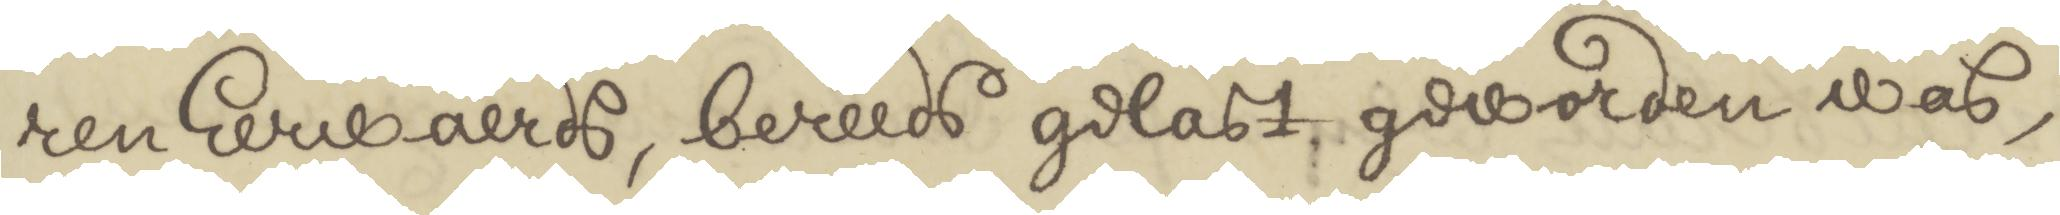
ren herwaerds, bereeds gelast, geworden was,
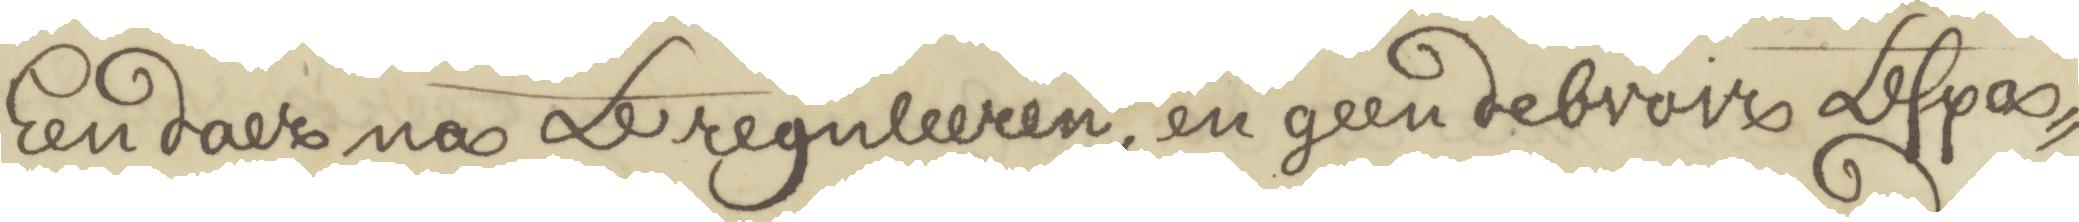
Een daer na te reguleeren, en geen debvoir te spa„
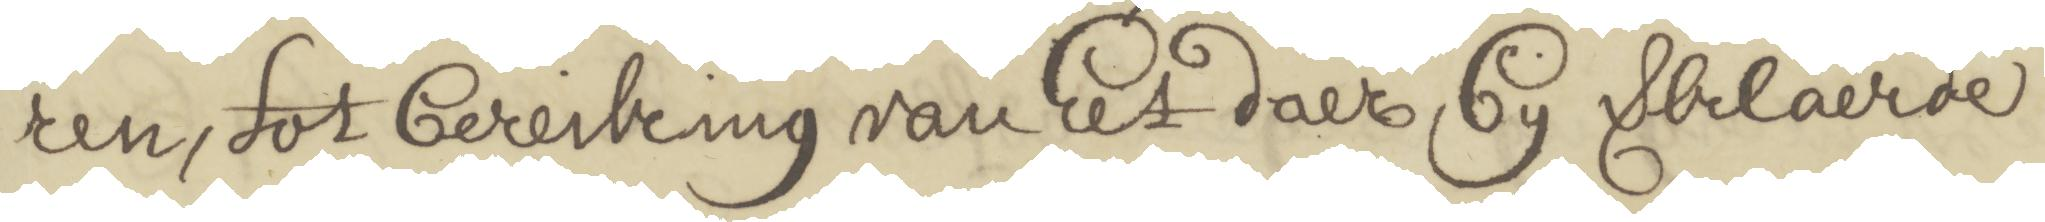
ren, tot bereiking van het daer, bij verklaerde
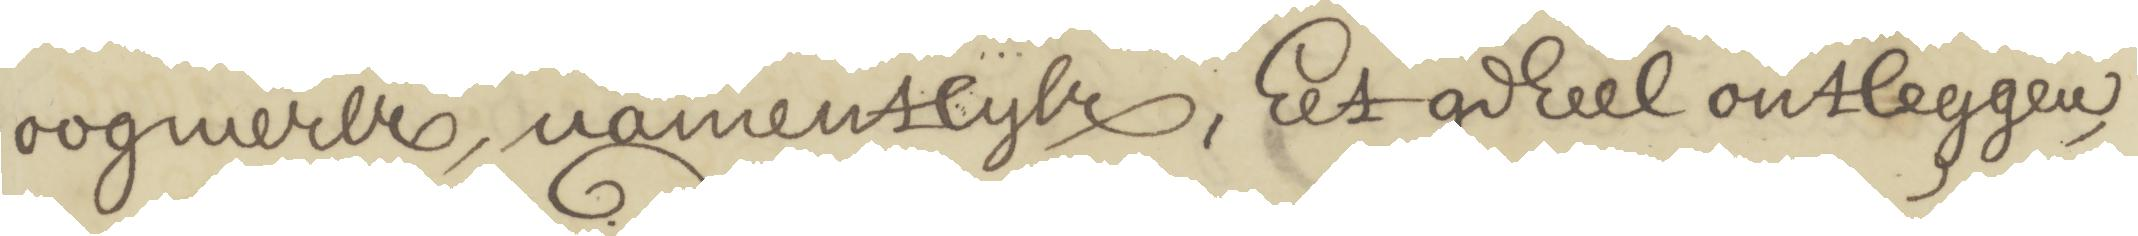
oogmerk, namentlijk, het geheel ontleggen,
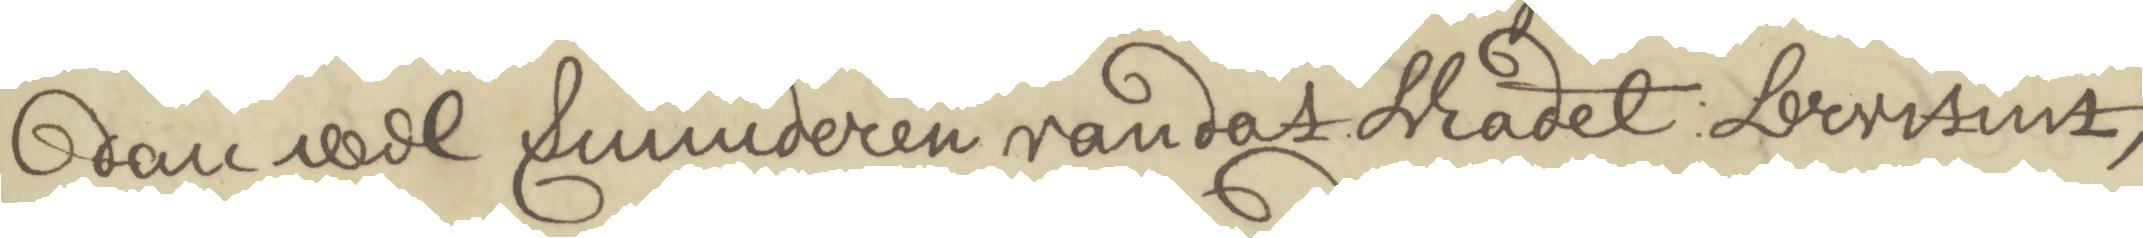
dan wel verminderen van dat schadel: servituit
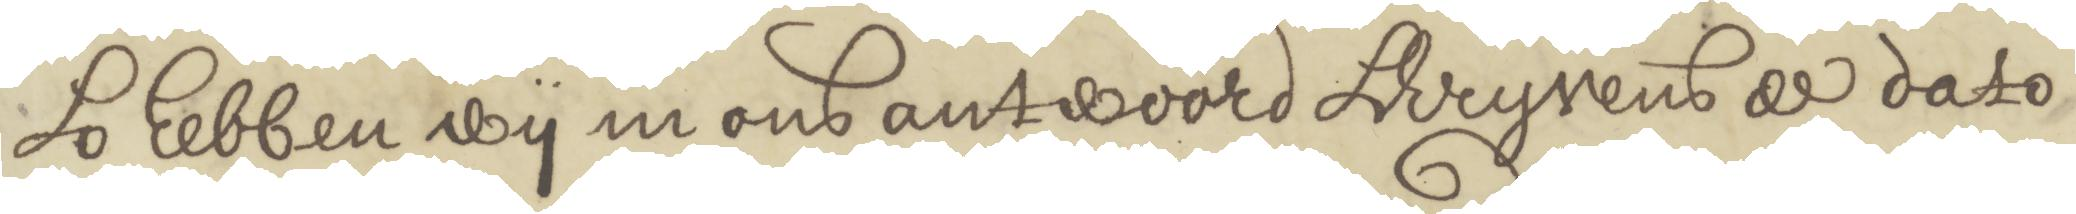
so hebben wij in ons antwoord schrijvens de dato
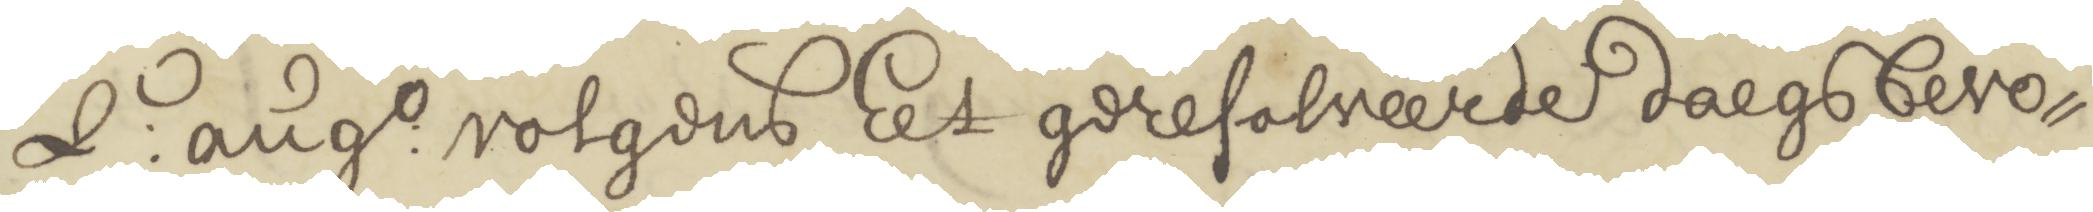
2:' aug:o volgens het geresolveerde daegs bevo„
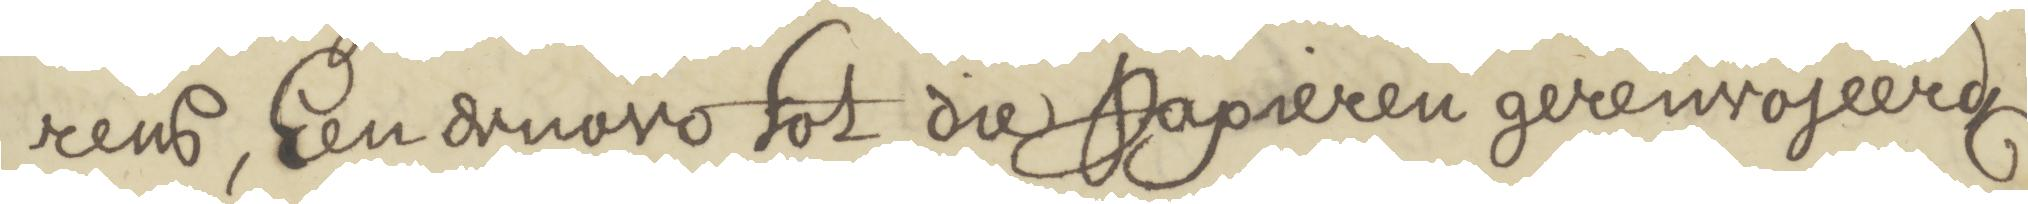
rens, Een denovo tot die Papieren gerenvojeerd,
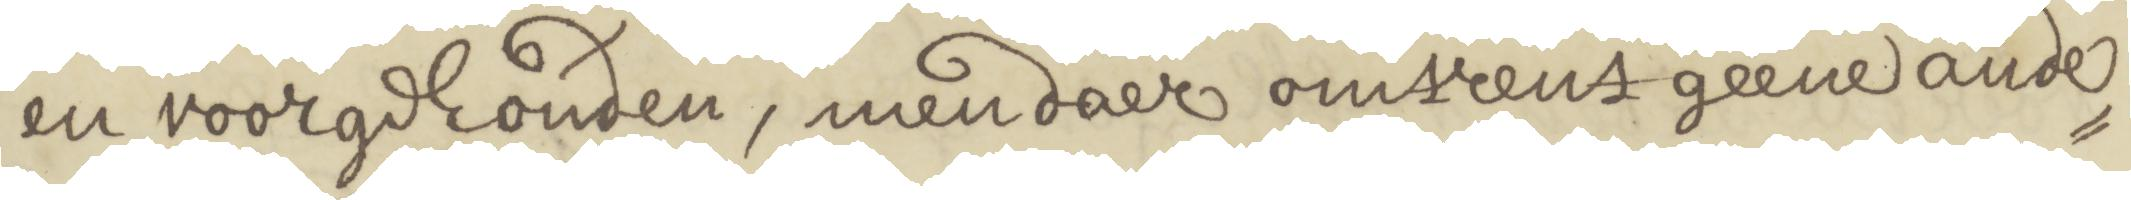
en voorgehouden, men daer omtrent geene ande„
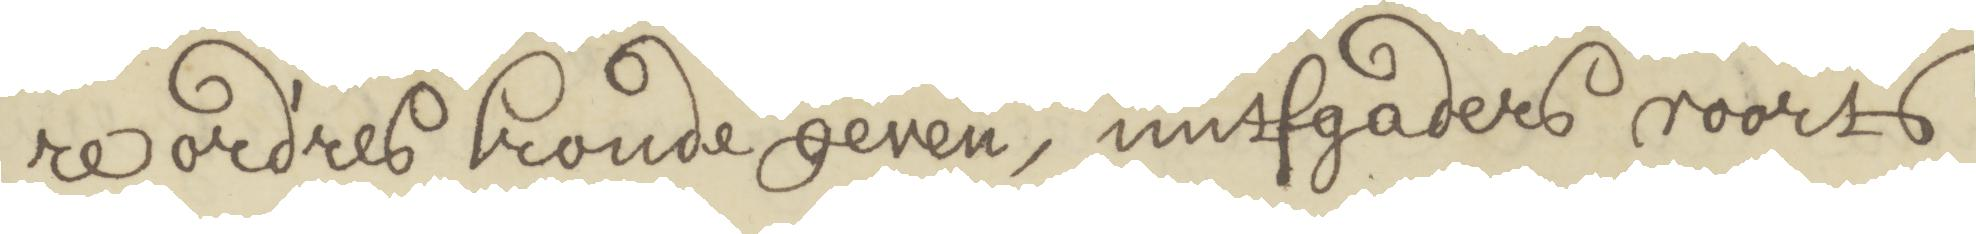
re ord'res konde geven, mitsgaders voorts
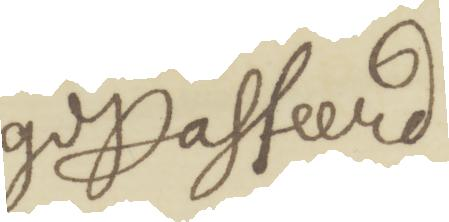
gepasseerd
